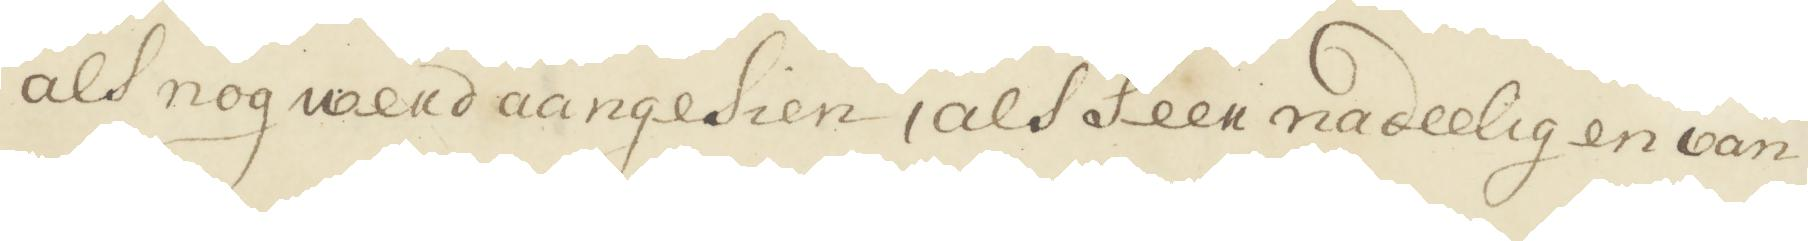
als nog werd aangesien, als Seer nadeelig en van
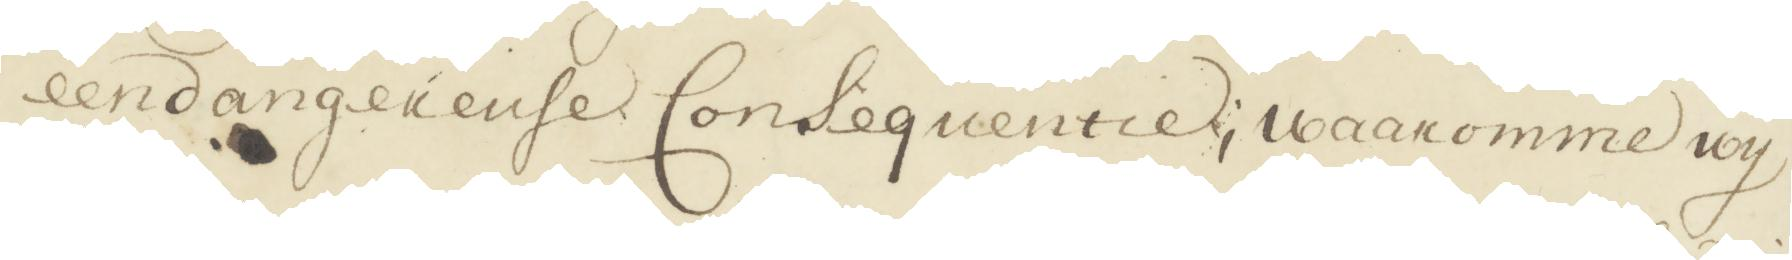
een dangereuse Consequentie; waar omme wij
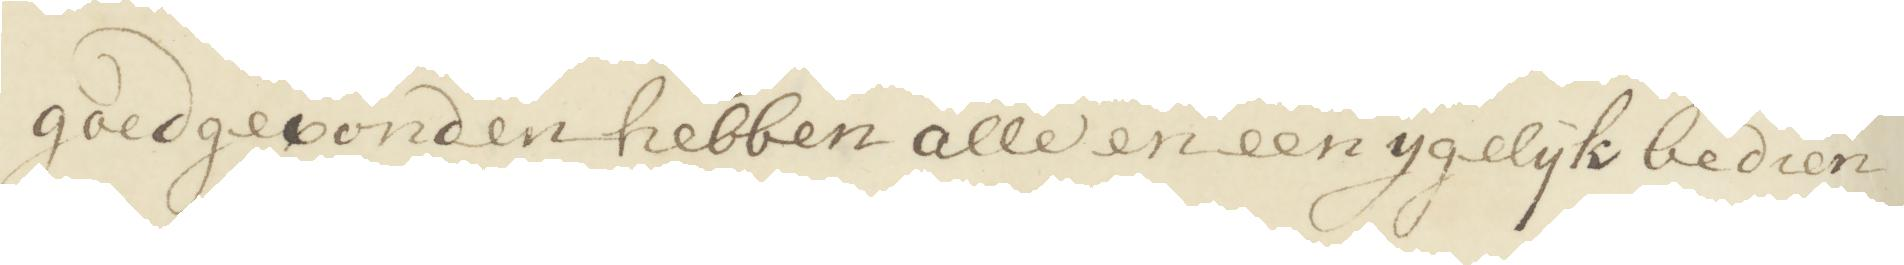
goedgevonden hebben alle en een ijgelijk bedien
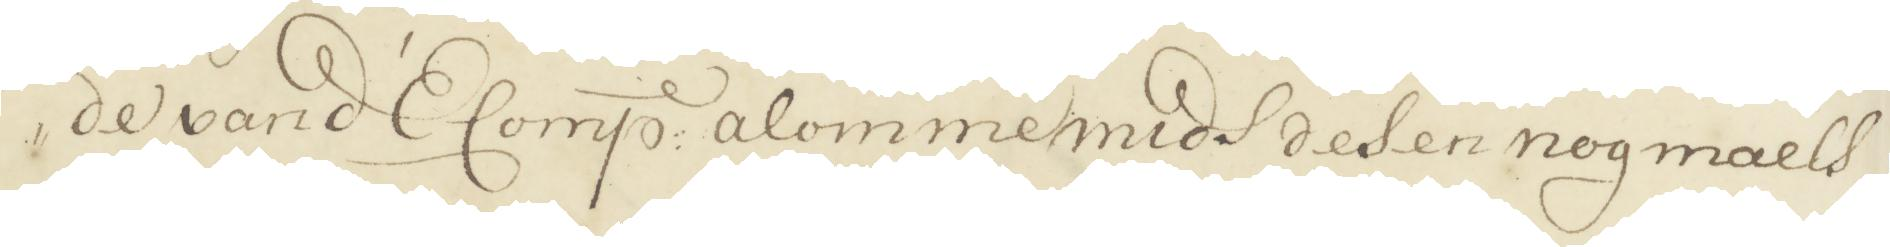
„de van d’ E Comp:e alomme mids desen nog maels
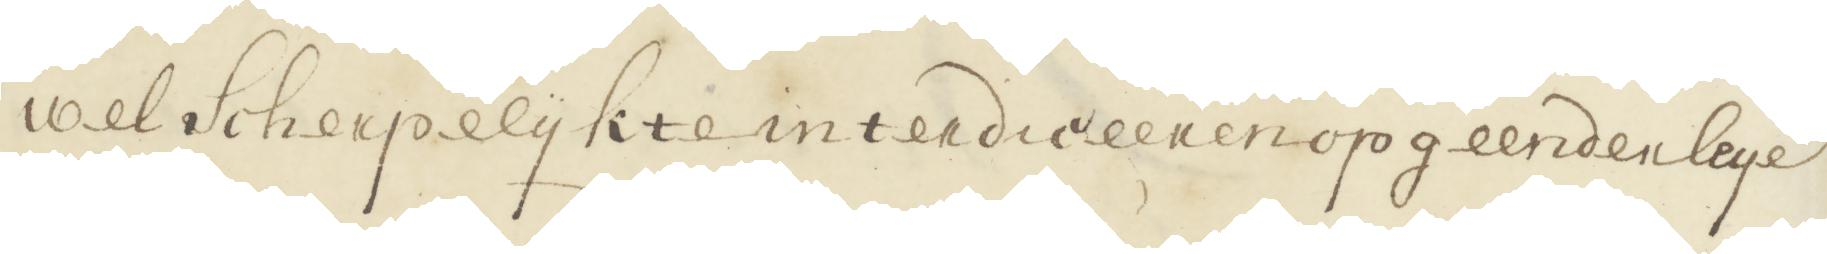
wel Scherpelijk te interdiceeren op geenderleye
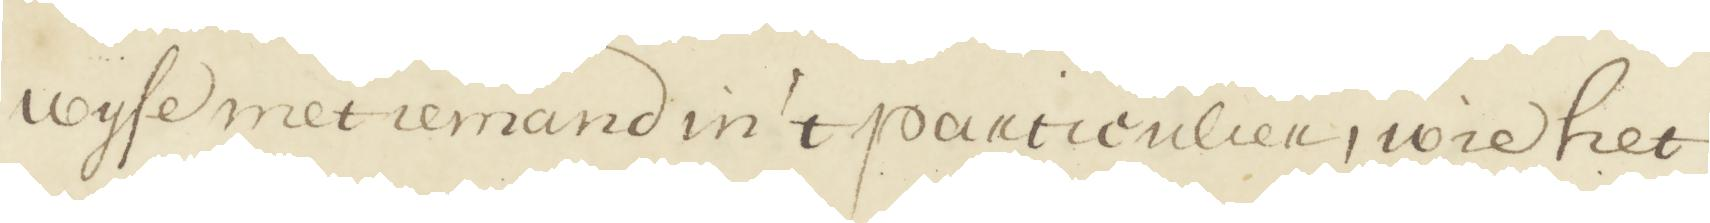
wijse met iemand in ’t particulier, wie het
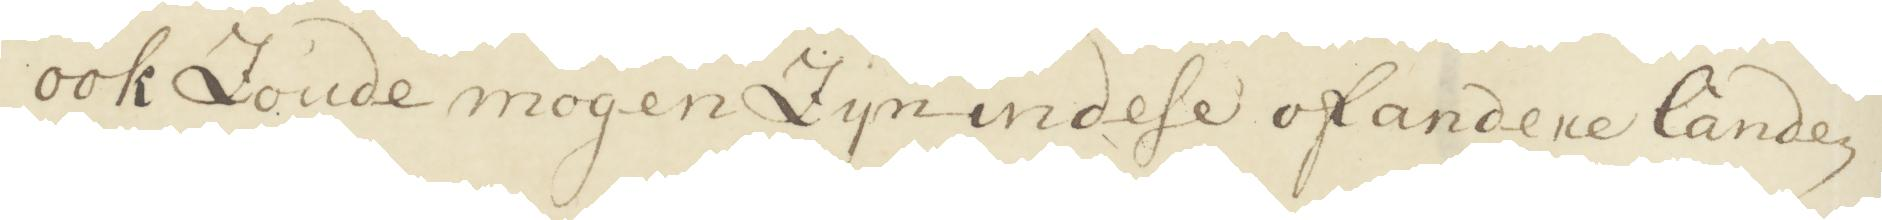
ook Zoude mogen Zijn in dese of andere landen
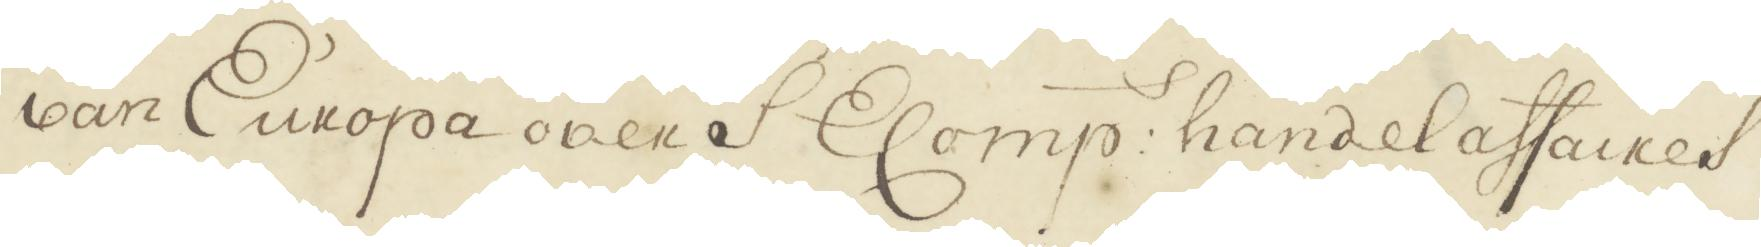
van Europa over 'S EComp:s handel affaires
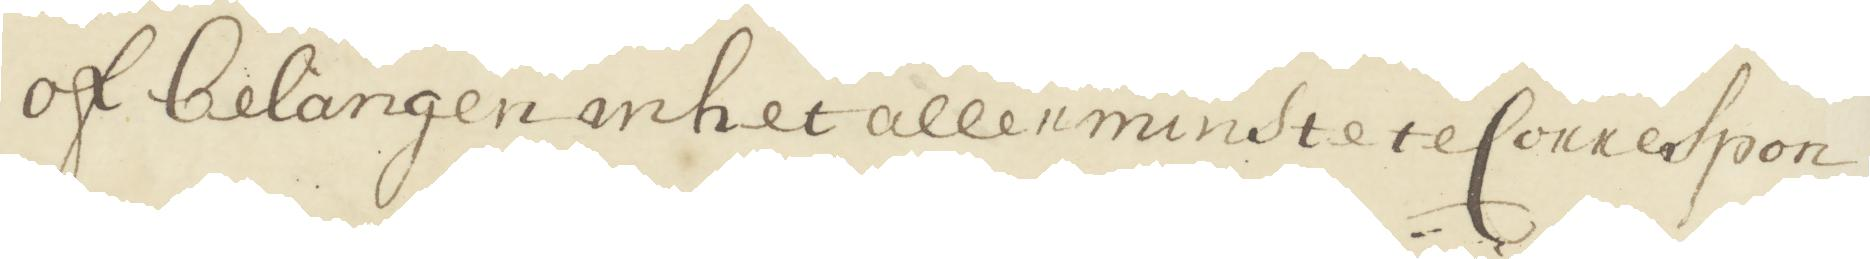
of belangen in het allerminste te Correspon
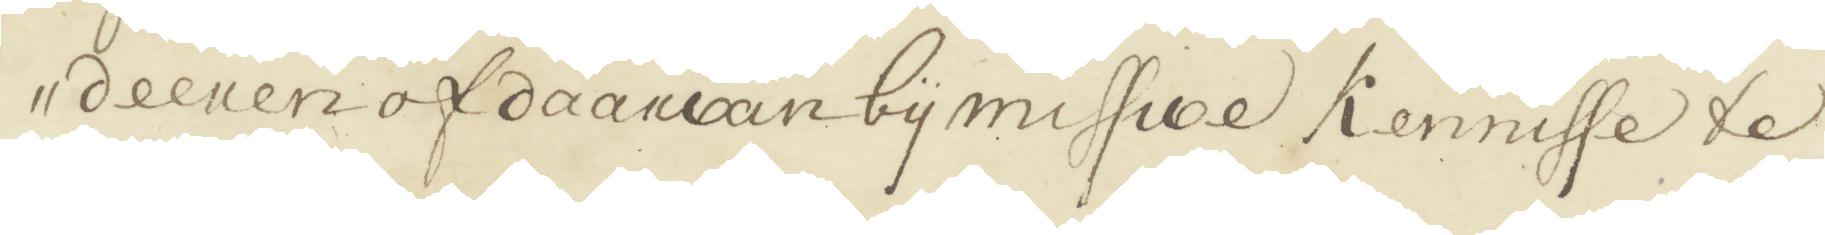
„deeren of daar van bij missive Kennisse te
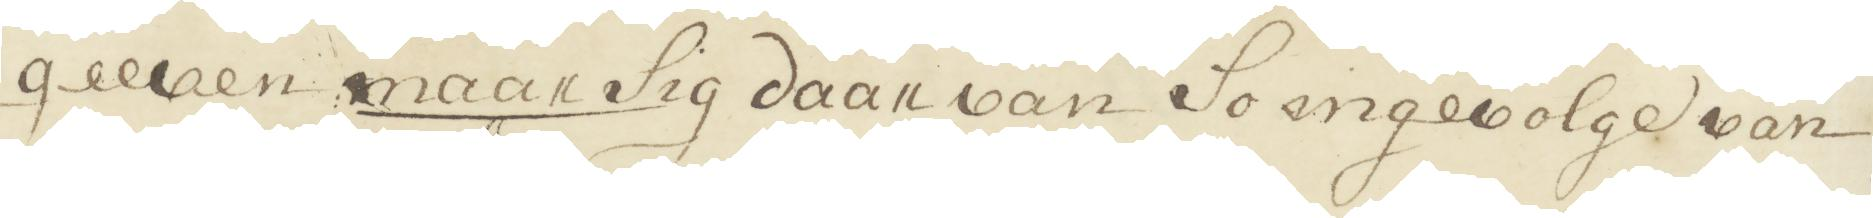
geeven maar Sig daar van So ingevolge van
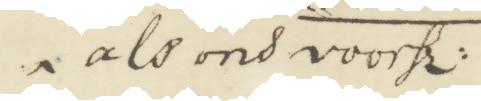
^ als ons voorsz:
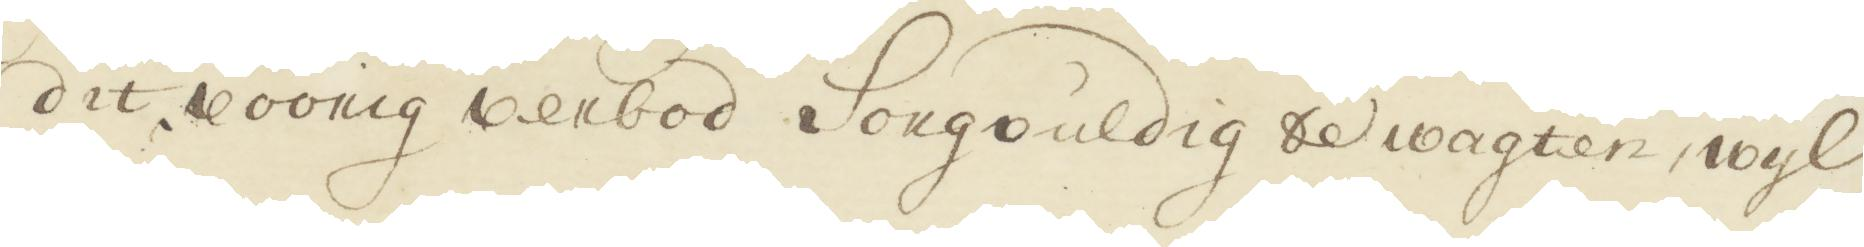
dit voorig verbod Sorgvuldig te wagten, wijl
